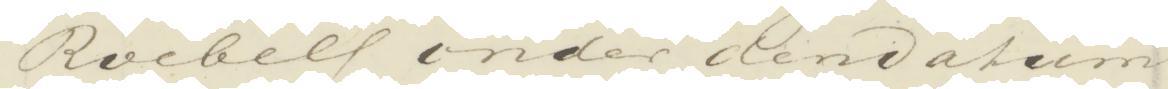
Roebels onder den datum
